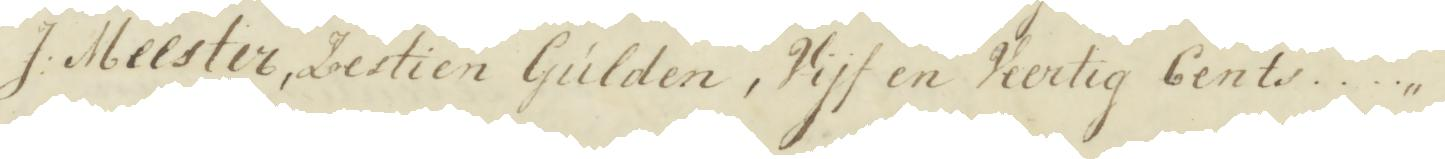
J: Meester, Zestien Gulden, Vijf en Veertig Cents . . . . „
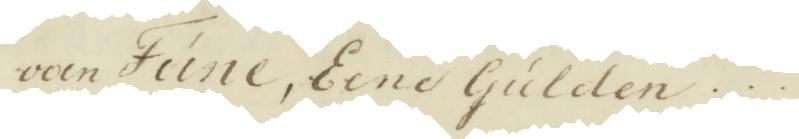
van Feene, Eene Gulden. . .
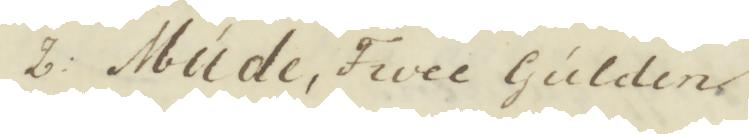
Z: Mude, Twee Gulden
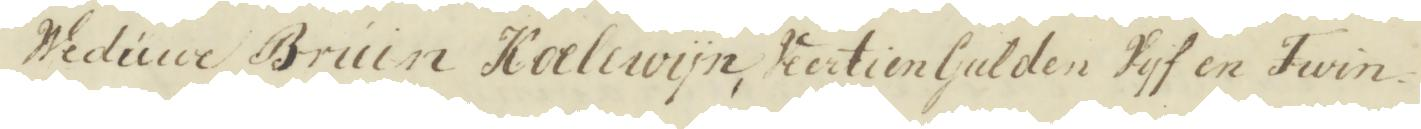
Weduwe Bruin Koelewijn, Veertien Gulden Vyf en Twin=
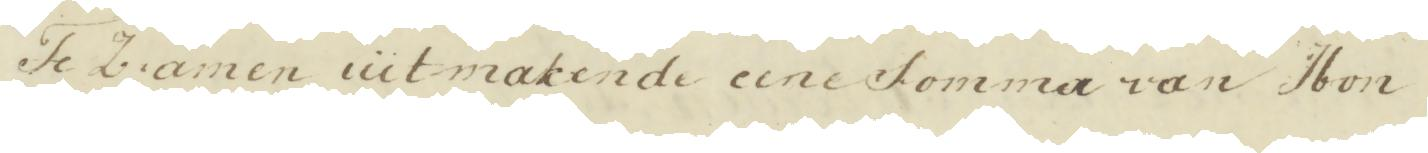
Te zamen uitmakende eene Somma van Hon
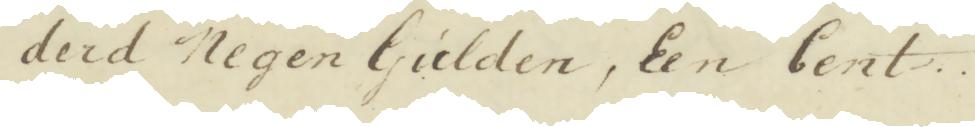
derd Negen Gulden, Een Cents.
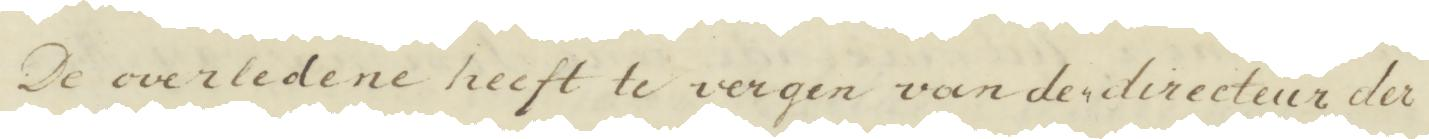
De overledene heeft te vergen van den directeur der
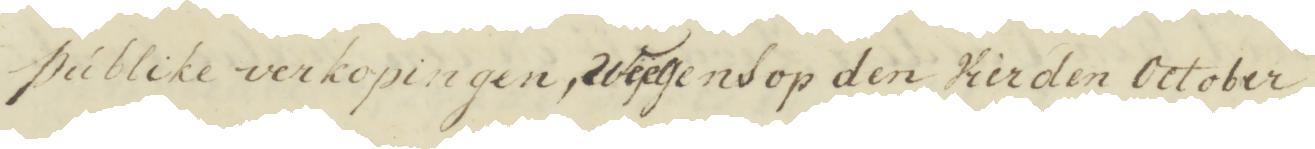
publike verkopingen, weegens op den vierden October
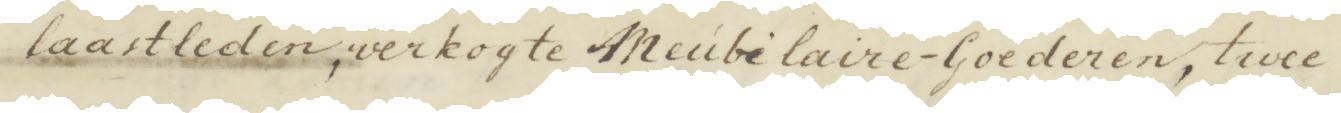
laastleden verkogte Meubelaire Goederen, twee
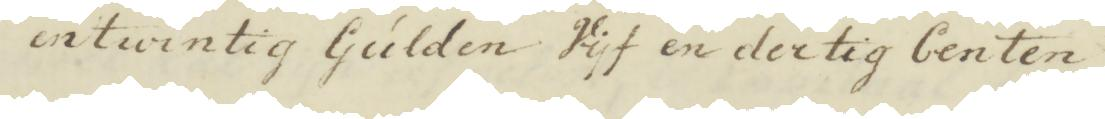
en twintig Gulden Vijf en dertig Centen
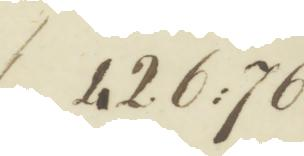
426.76
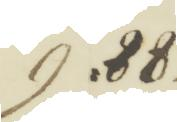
9.88½
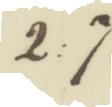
2:75.
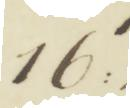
16:
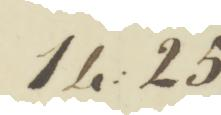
14:25
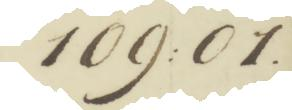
109:01.
